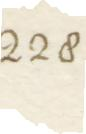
228.
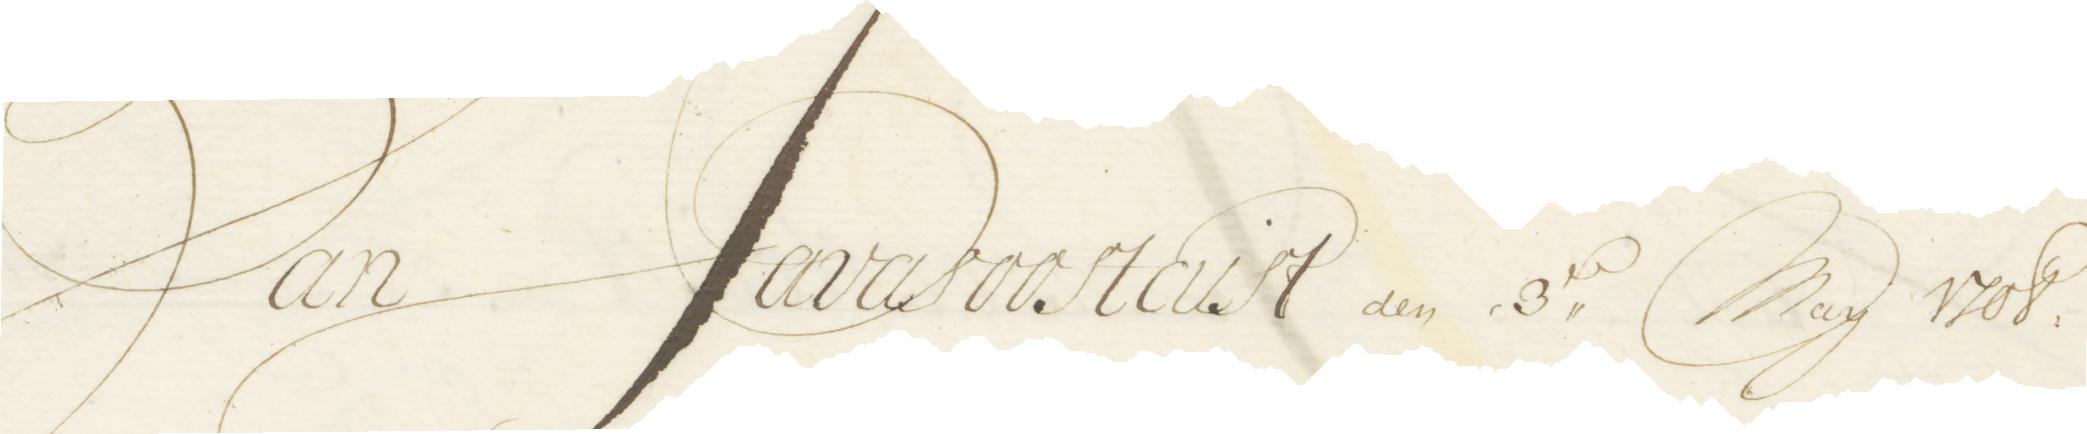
Van Javas oostcust den 3„e Maij 1708:
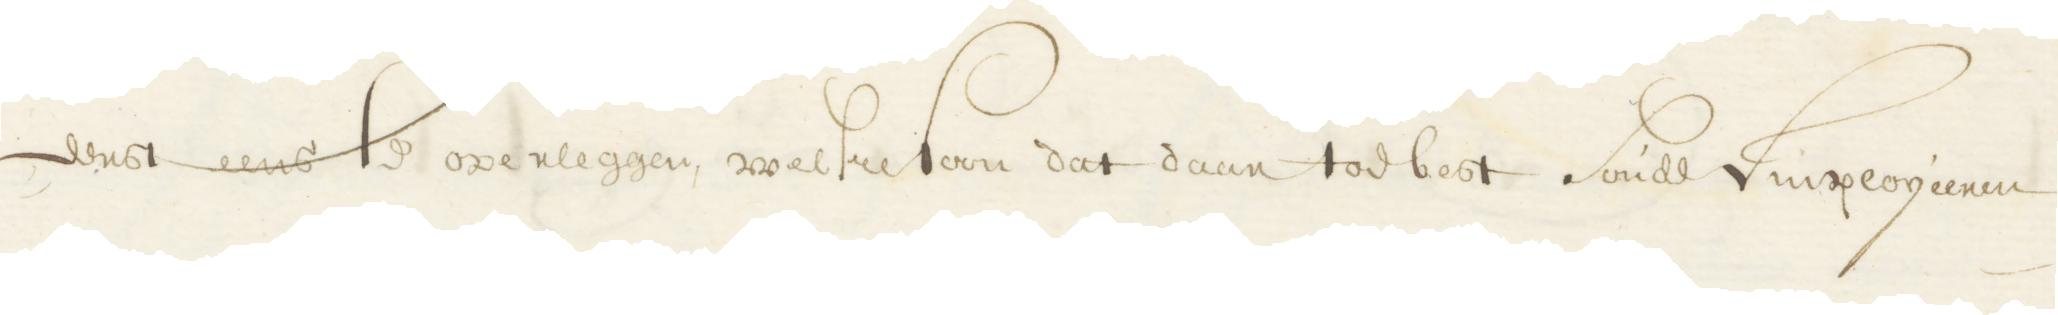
eerst eens te overleggen, welke Soon dat daar toe best soude Emploijeeren
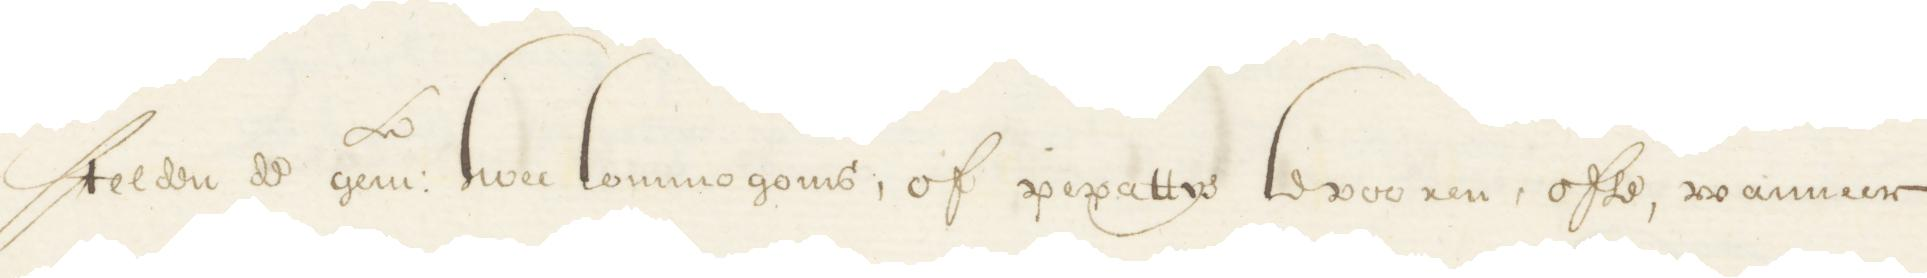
stelden de gem:te twee tommogoms, of pepattys tevooren, ofte, wanneer
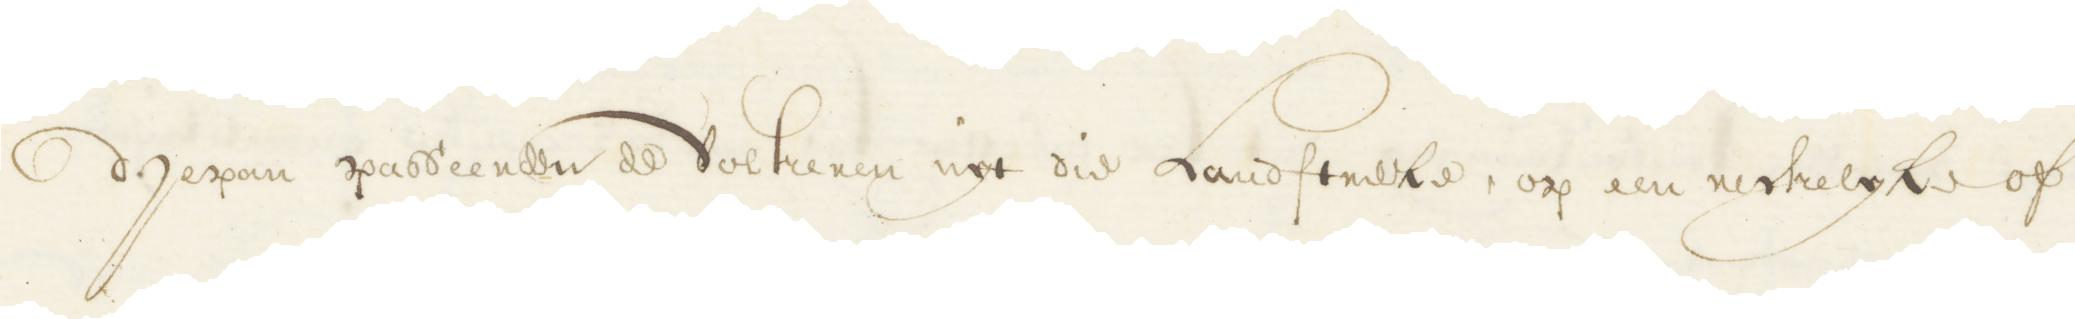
djepan passeerden de volkeren uyt die Landstreeke, op een reckelyke of
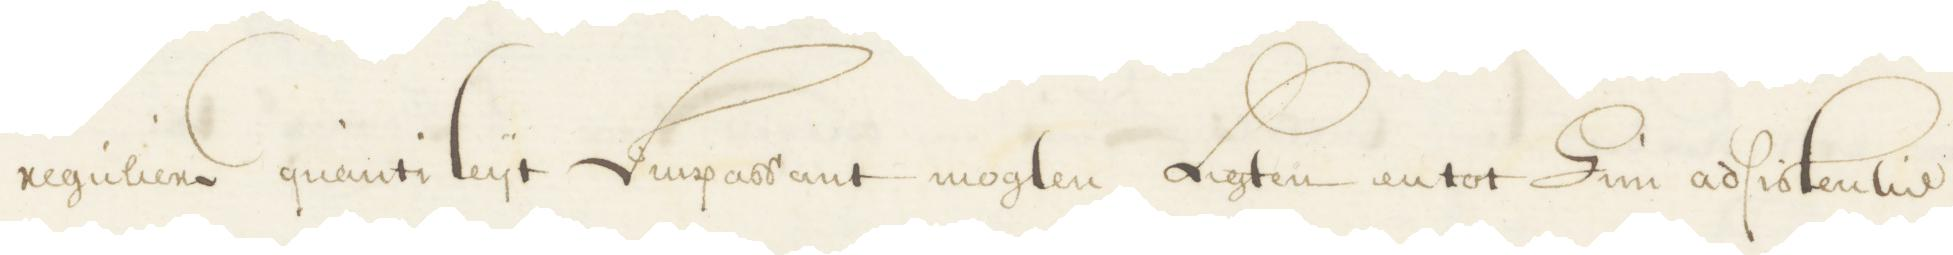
regulier quantiteijt Empassant mogten Ligten en tot hun adsistentie
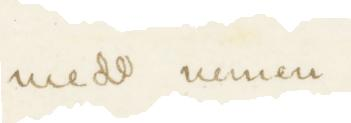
mede nemen
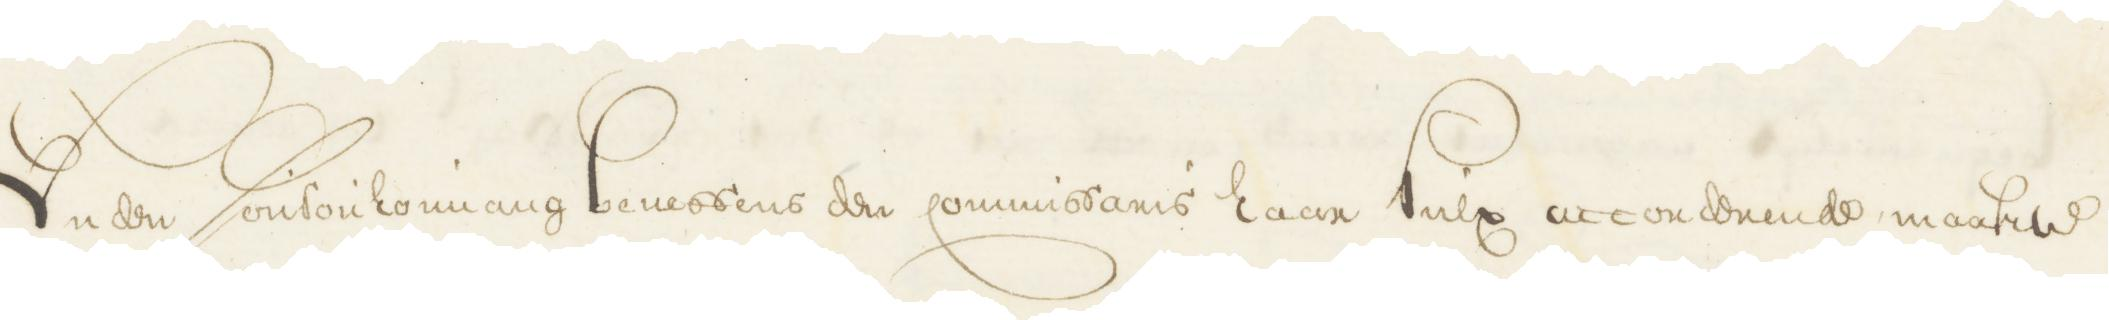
En den Sousouhounang beneffens den commissaris haar sulx accorderende maakte
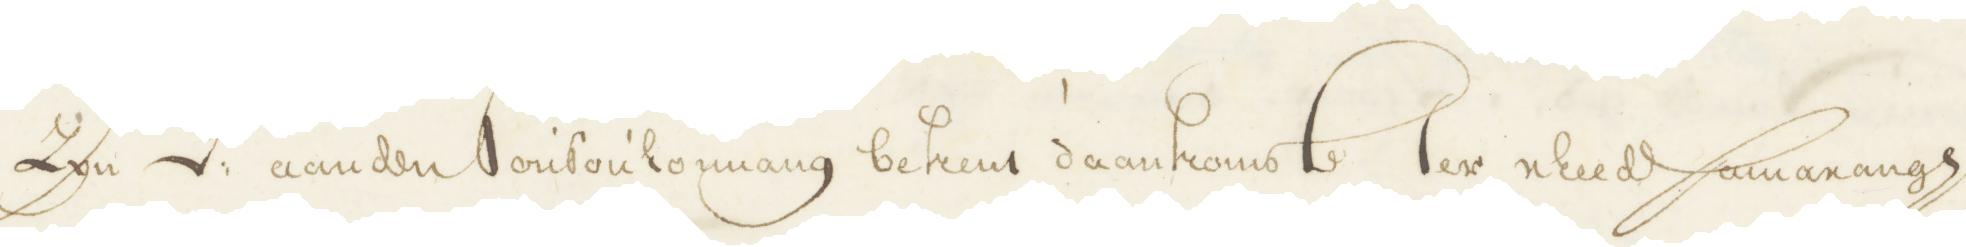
Zyn E: aan den Sousouhounang bekent d'aankomste ter rheede Samarangh
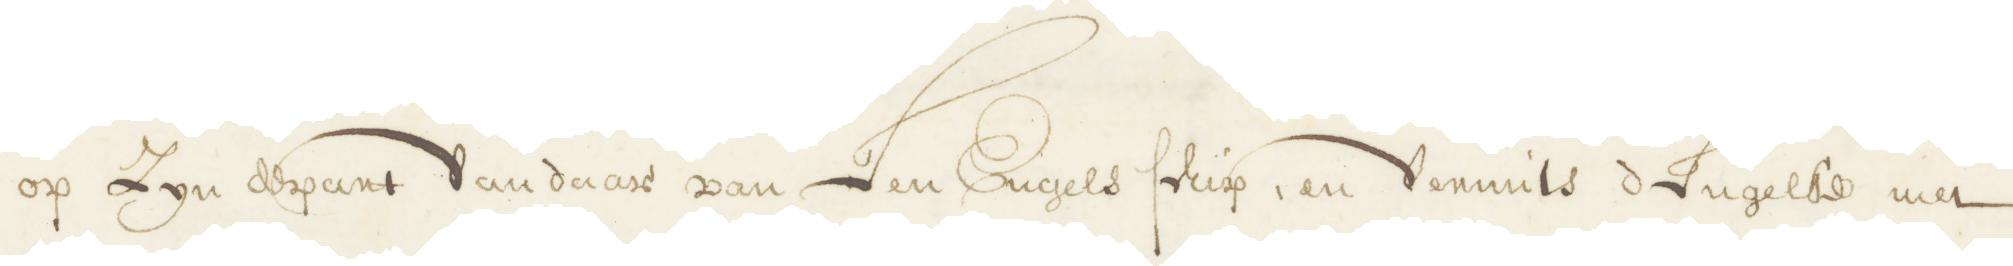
op Zyn depart Van daar van Een Engels schip, en vermits d' Engelse niet
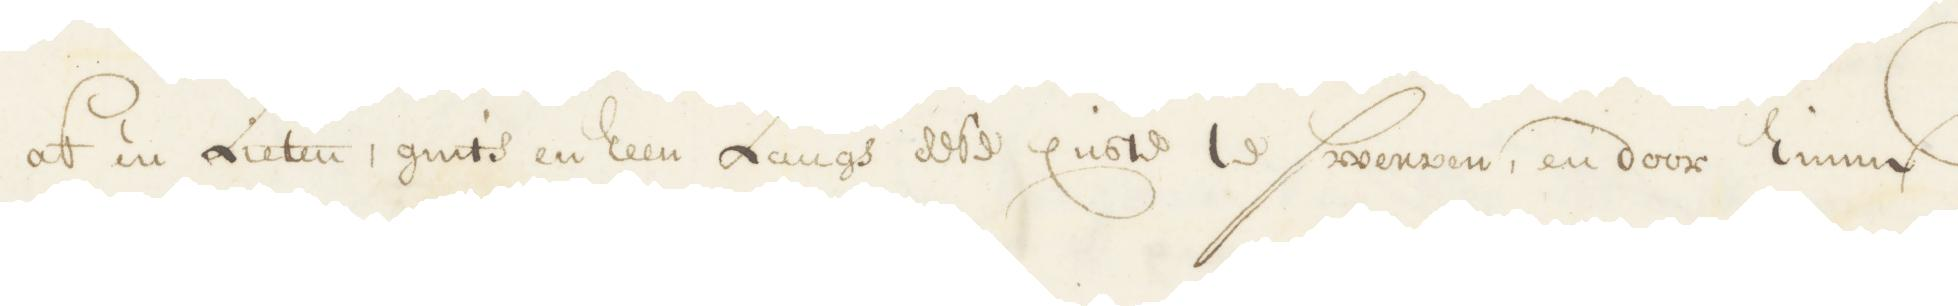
af en Lieten, gints en heen Langs dese custe te Swerven, en door hunne
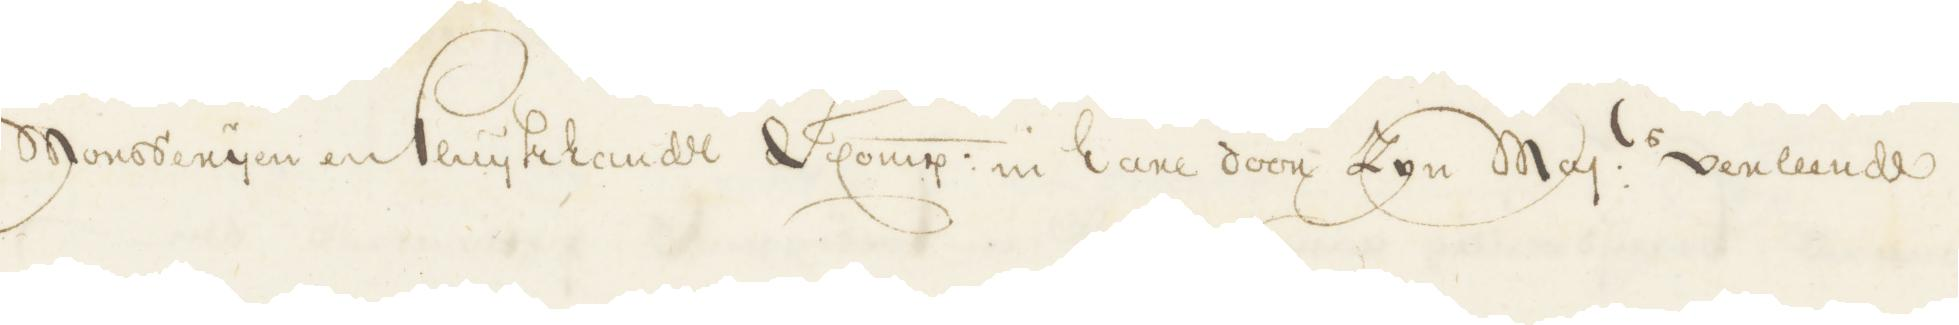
morsserijen en Sluijkhandel dE comp: in hare door Zyn Maj:ts verleende
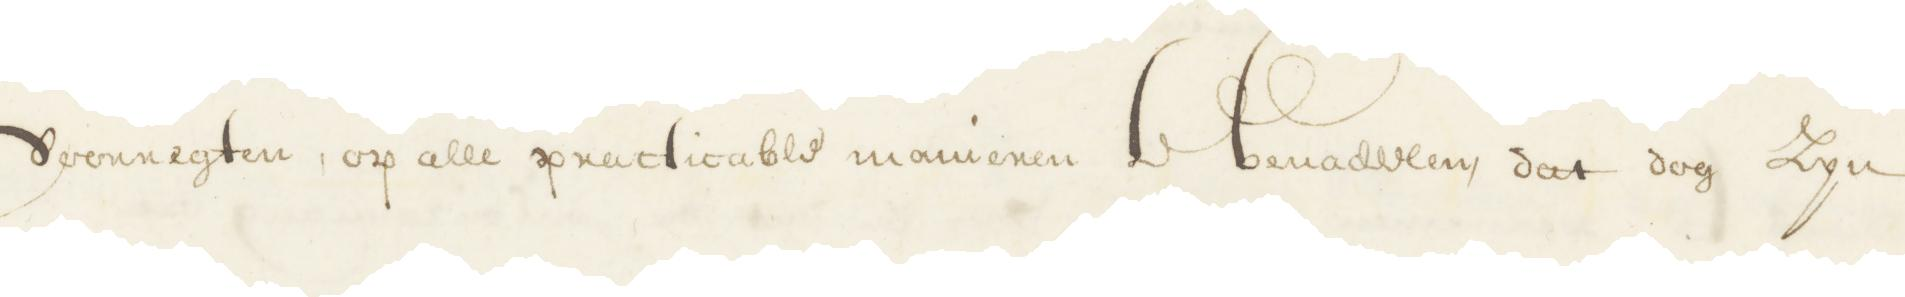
Voorregten, op alle practicable manieren te benadeelen dat dog Zyn
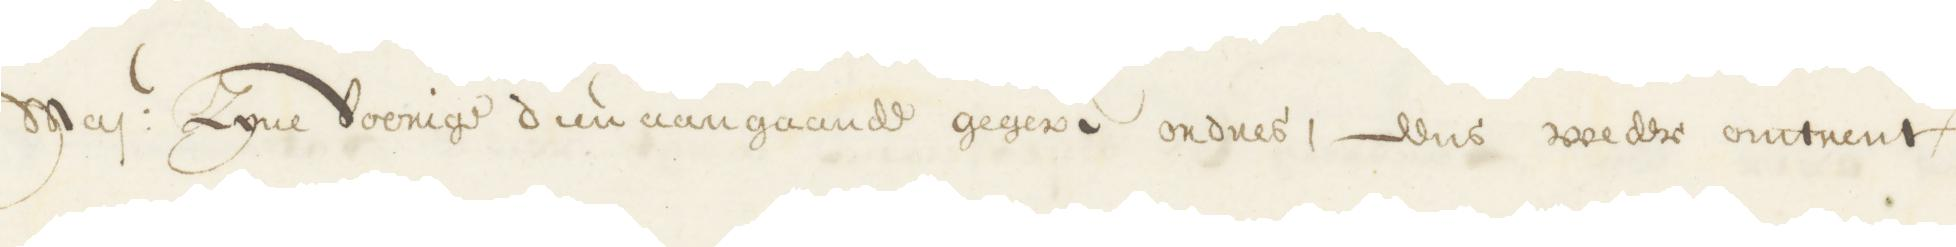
Maj:t Zyne voorige dien aangaande gegeve ordres, eens weder omtrent
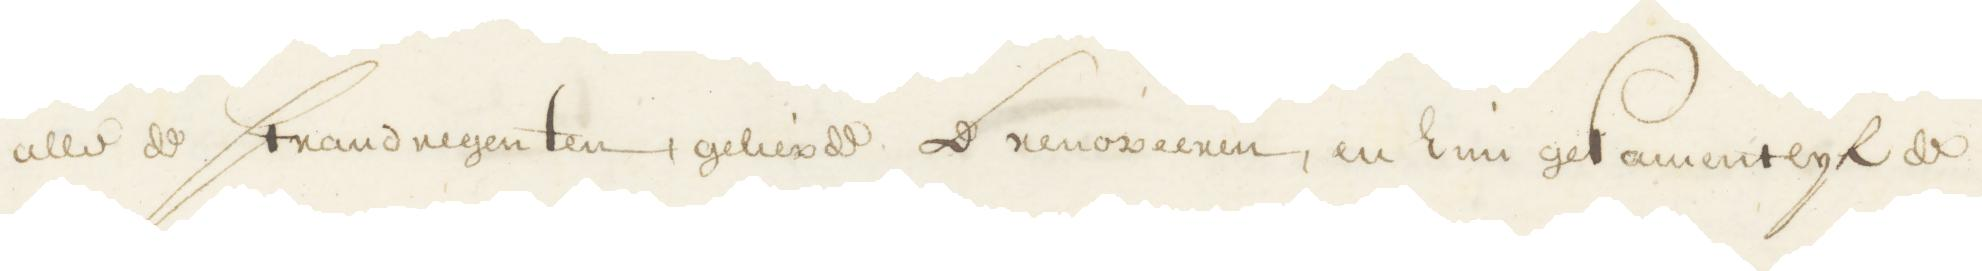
alle de Strandregenten, gelievde te renoveeren, en hun gesamentlyk de
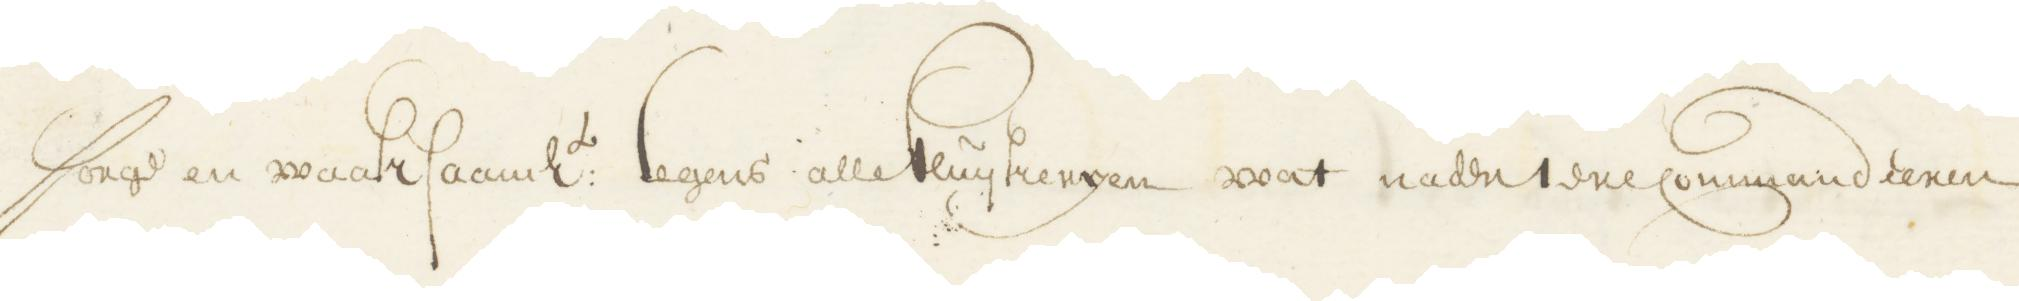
Sorge en waaksaamh:t tegens alle Sluijkeryen wat nader te recommanderen
